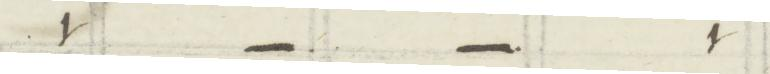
1 —. —. 1
